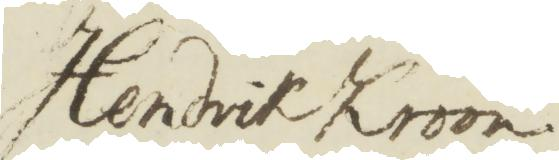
Hendrik Kroon
